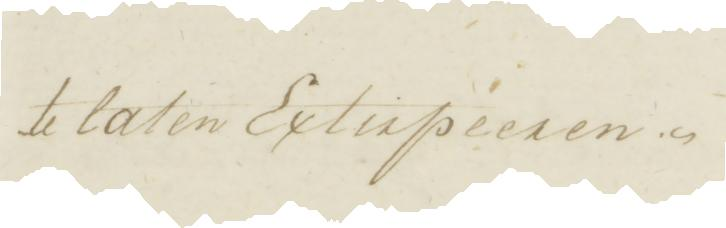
te laten Extirpeeren.-
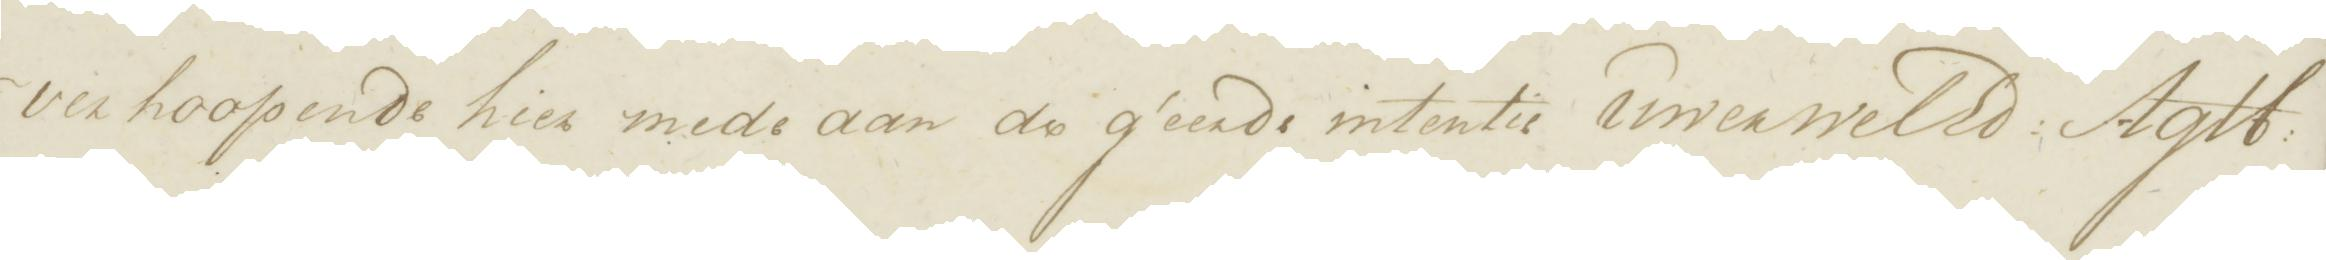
verhoopende hier mede aan de g'eerde intentie uwer welEd: Agtb:
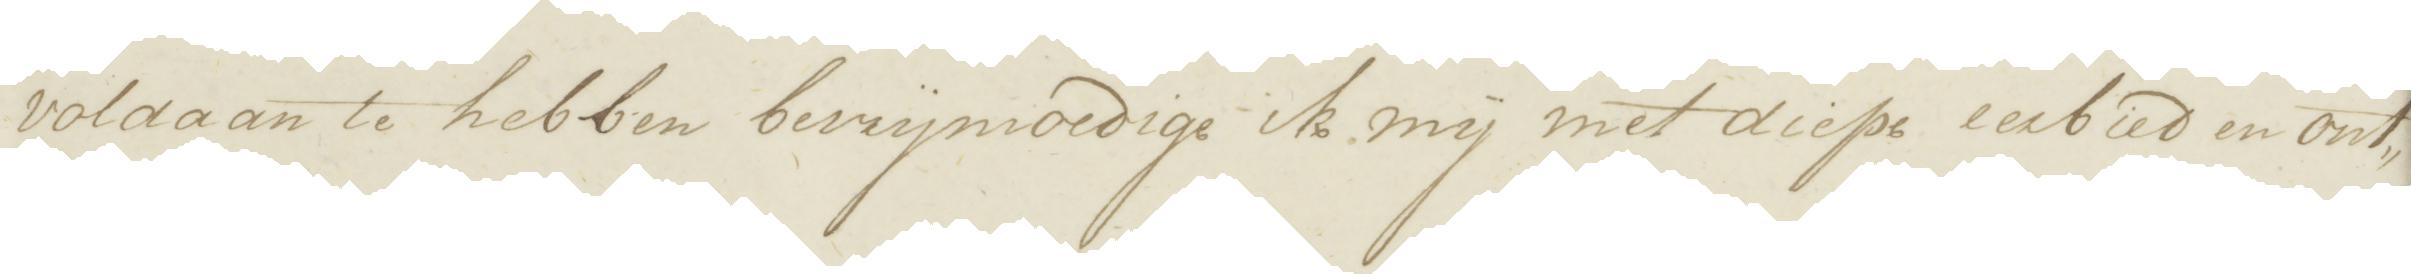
voldaan te hebben bevrijmoedige ik mij met diepe eerbied en ont„
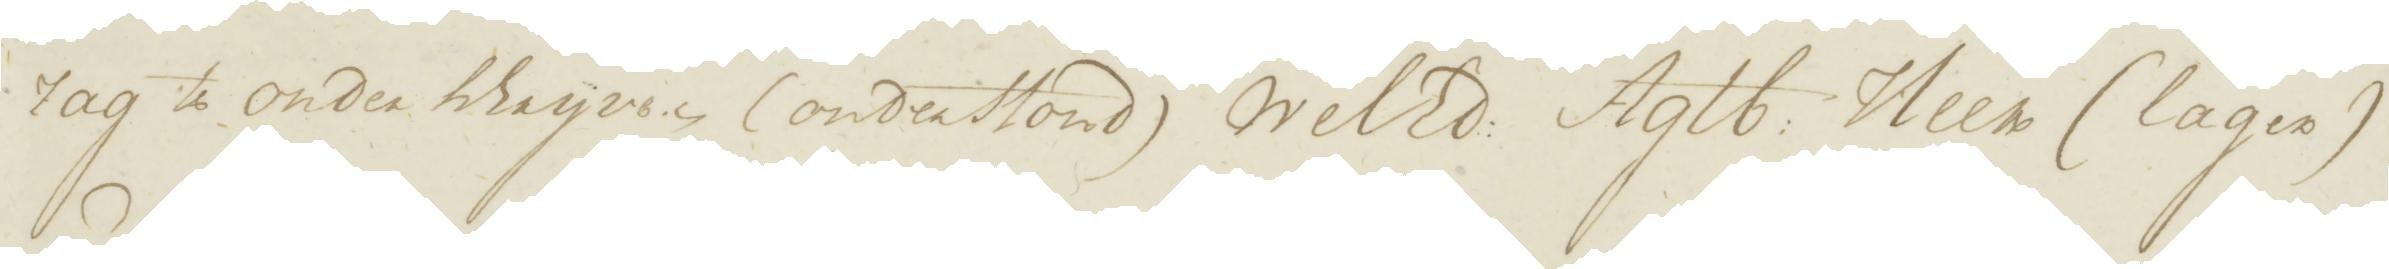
zag te onder schrijven (onderstond) welEd: Agtb: Heer (lager)
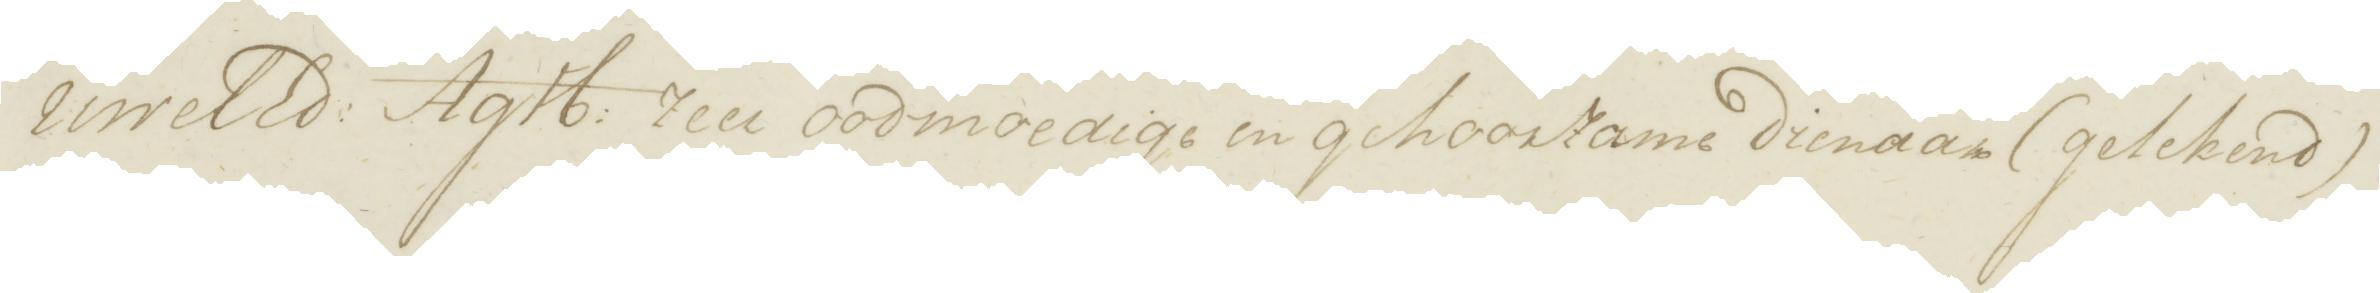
uwelEd: Agtb: zeer oodmoedige in gehoorzame dienaar (getekend)
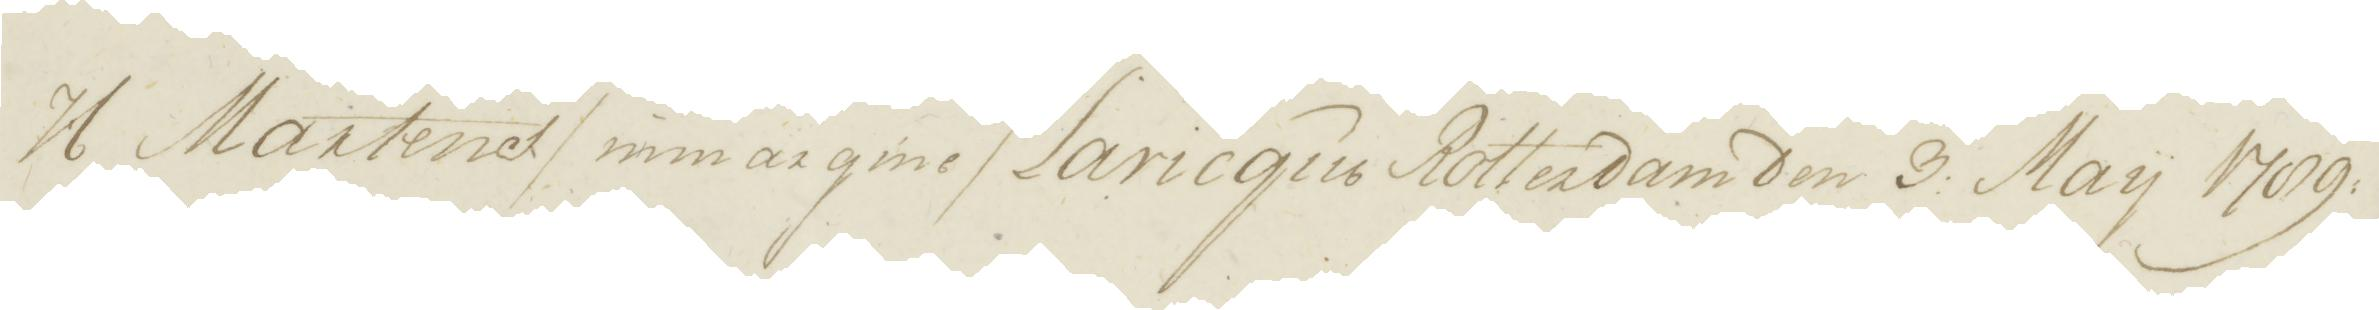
H Martens / inmargine/ Laricque Rotterdam den 3: Maij 1789:
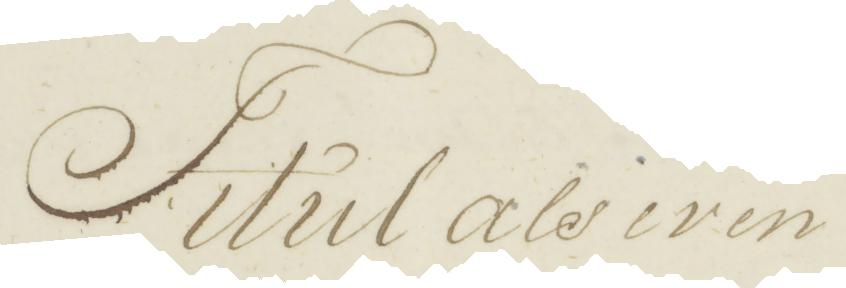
Titul als even
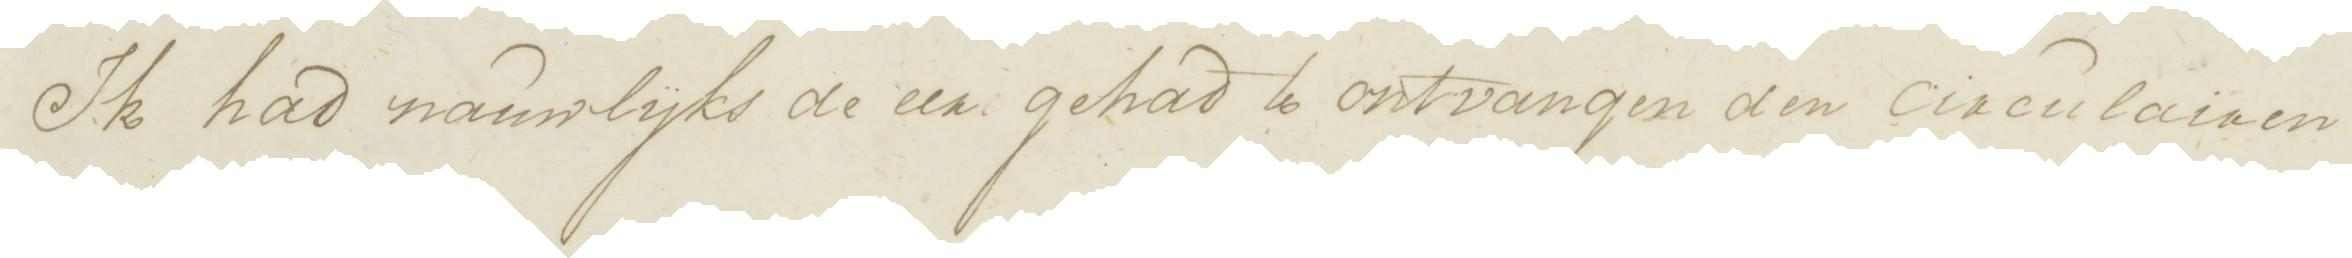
Ik had nauwlijks de eer gehad te ontvangen den circulairen
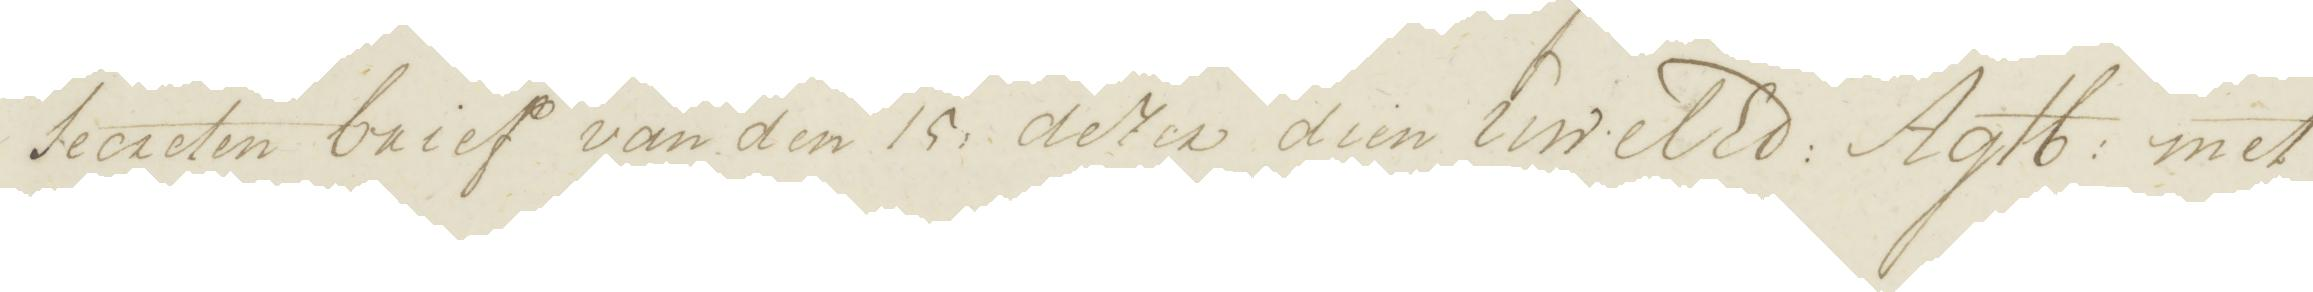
secreten brief van den 15: dezer dien uw.elEd: Agtb: met
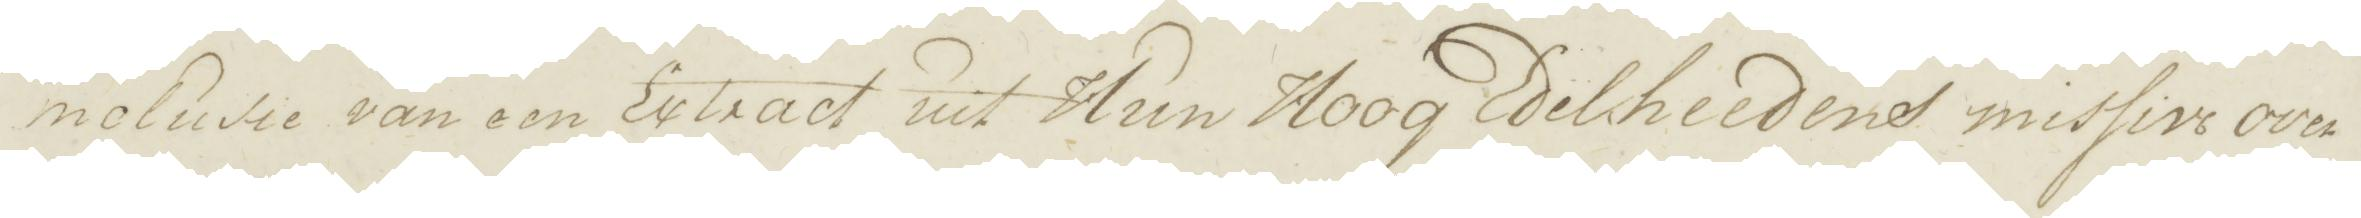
inclusie van een Extract uit Hun Hoog Edelheedens missive over
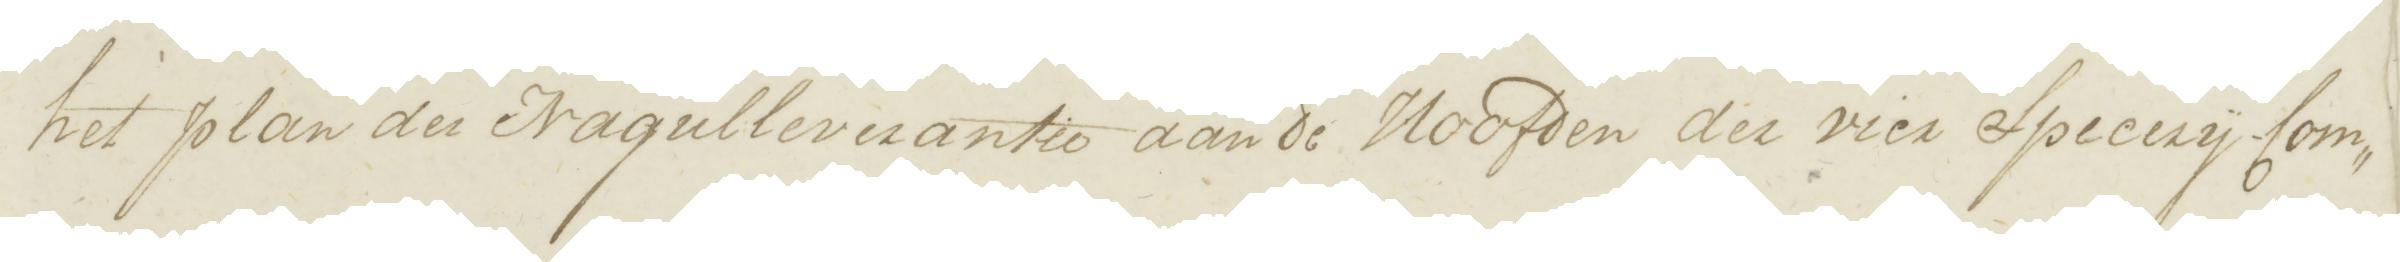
het plan der Nagulleverantie aan de Hoofden der vier Specerij Com„
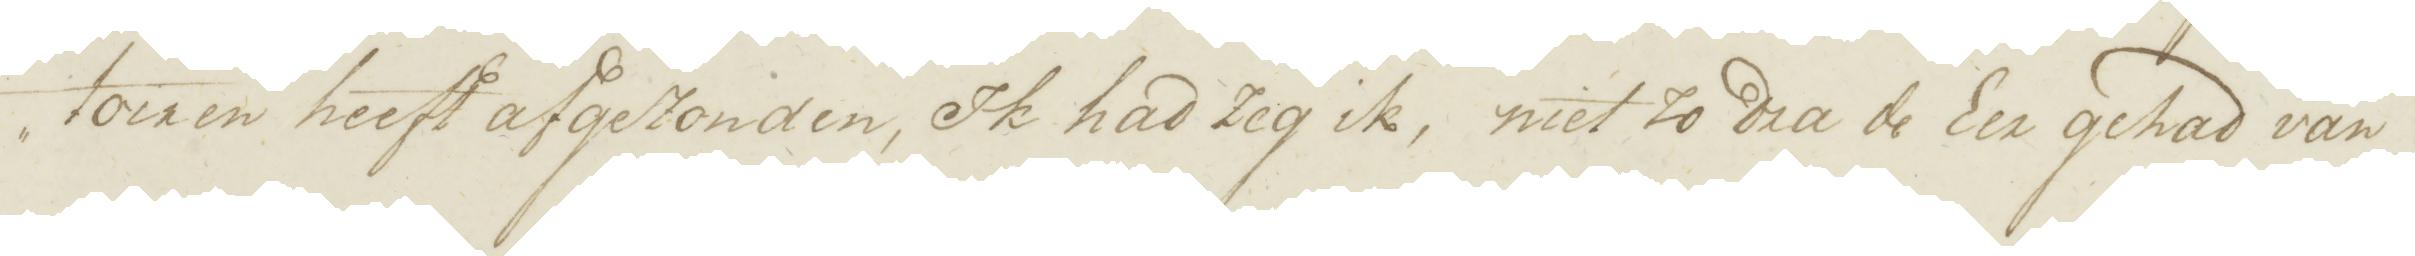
„toiren heeft afgezonden, Ik had zeg ik, niet zo dra de Eer gehad van
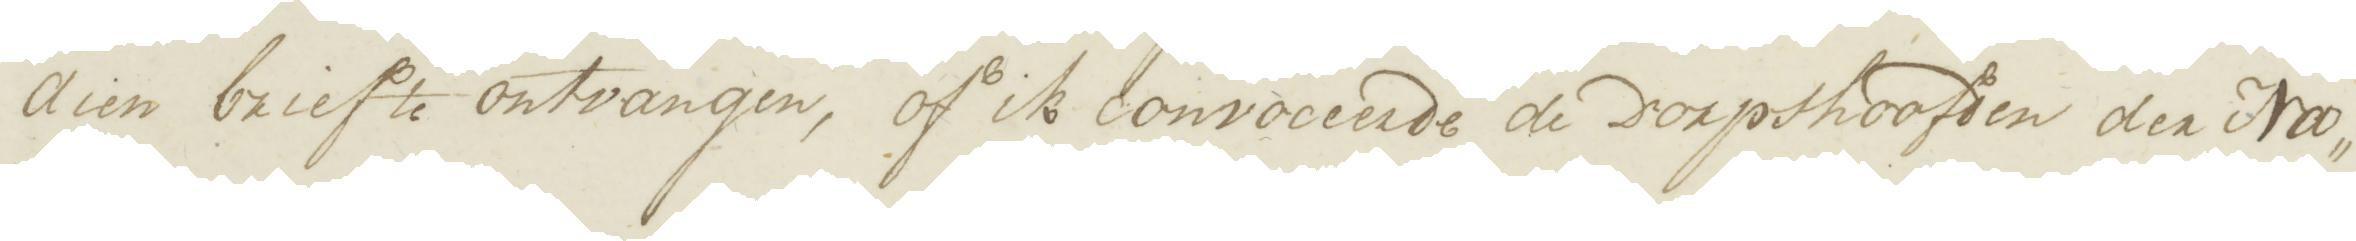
dien brief te ontvangen, of ik convoceerde de Dorpshoofden der Na
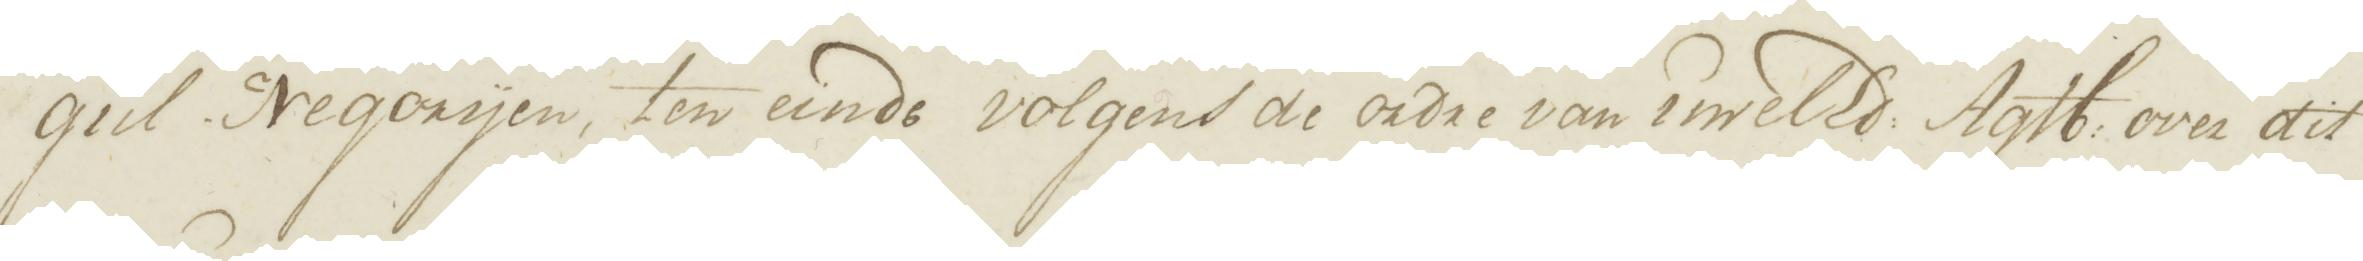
gul Negorijen, ten einde volgens de ordre van Uwel Ed: Agtb: over dit
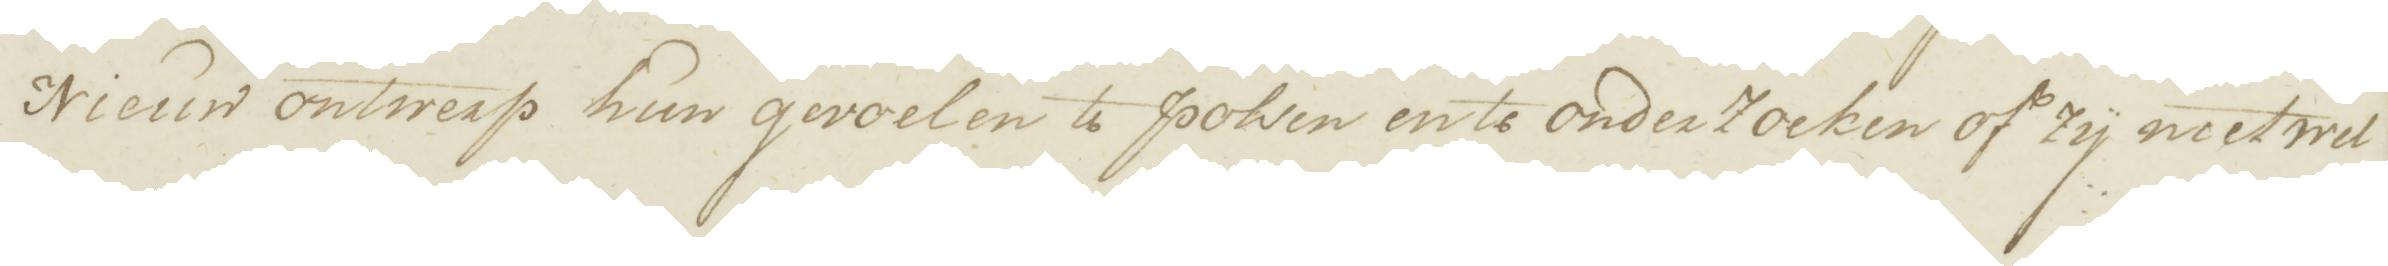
Nieuw ontwerp hun gevoelen te polsen en te onder zoeken of zij niet wel
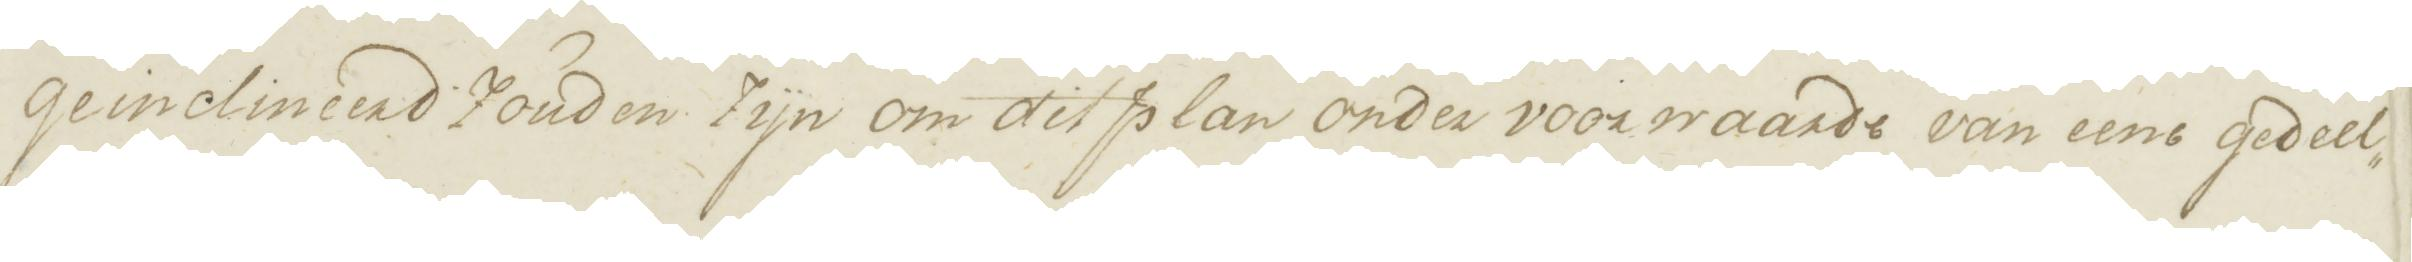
geinclineerd zouden zijn om dit plan onder voorwaarde van eene gedeel„
